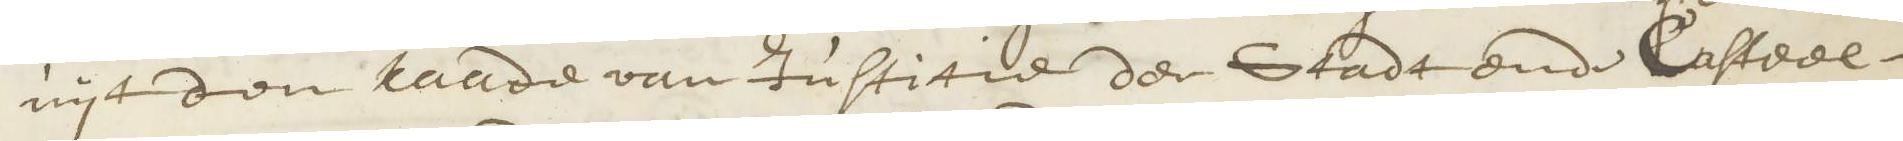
uijt den raade van Justitie der stadt ende Casteel
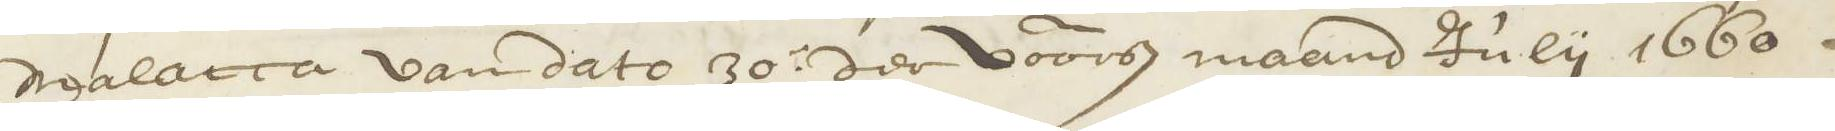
malacca van dato 30.' der voorsz maand Julij 1660
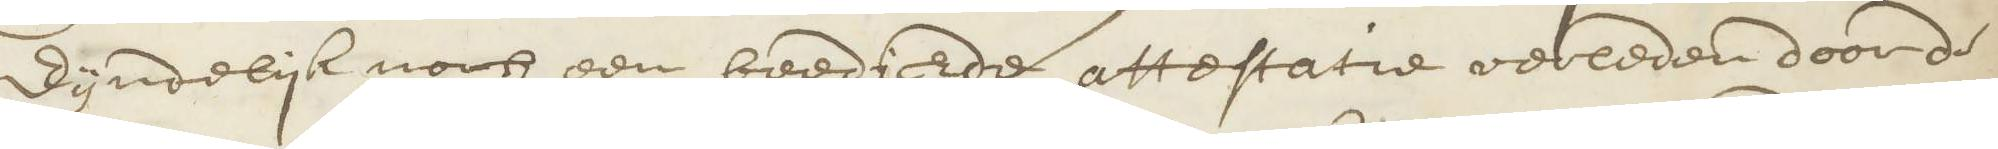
Eijndelijk noch een beedichde attestatie verleden door de
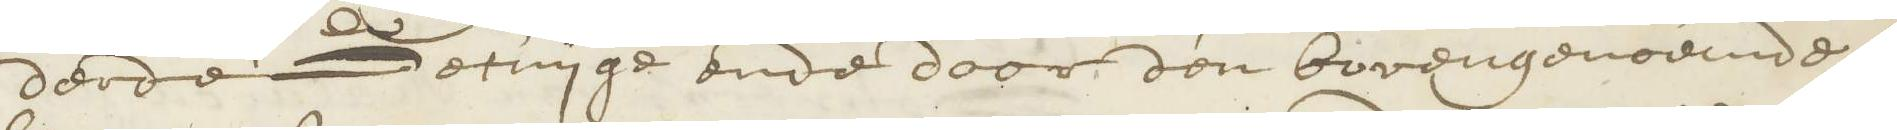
derde Getuijge ende door den bovengenoemde —
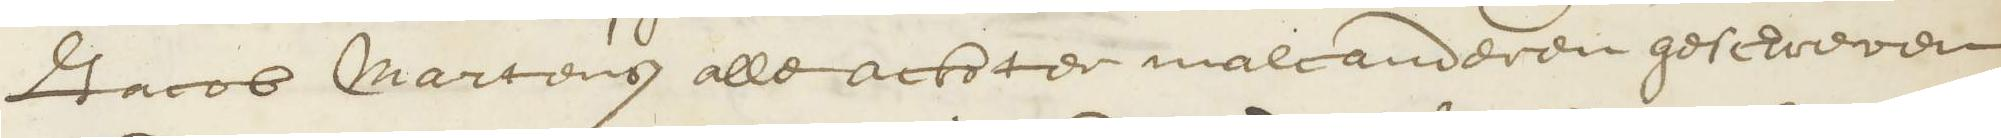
Jacob Martens alle achter malcanderen geschreven
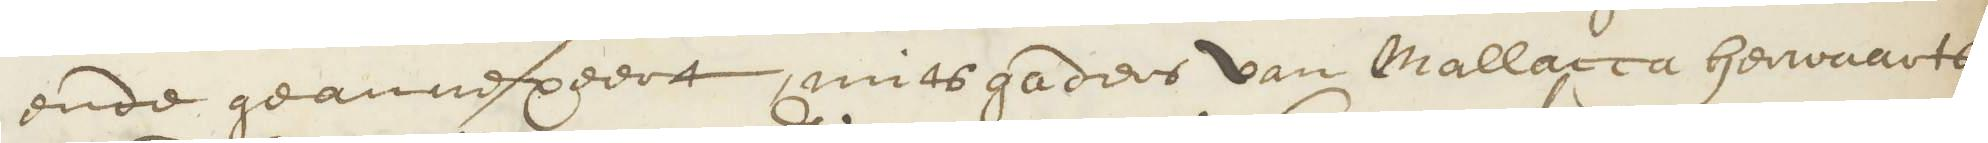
ende geannexeert, mitsgaders van Mallacca herwaarts
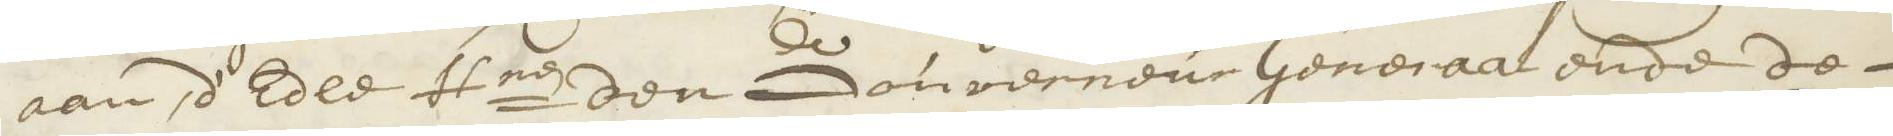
aan, d’ Edle H=re den Gouverneur Generaal ende de-
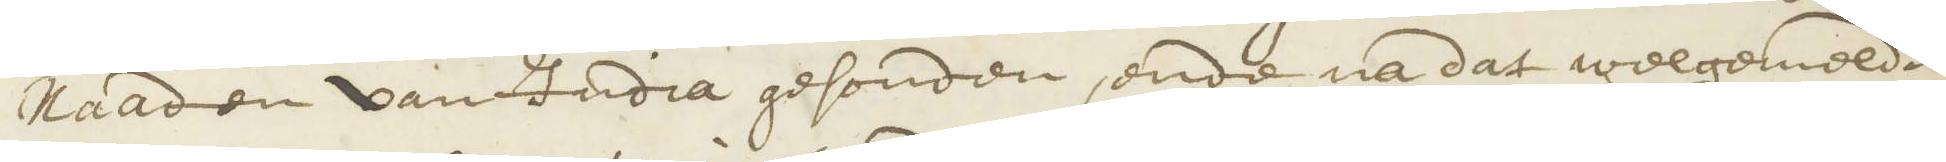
Raaden van Jndia gesonden, ende na dat welgemelde
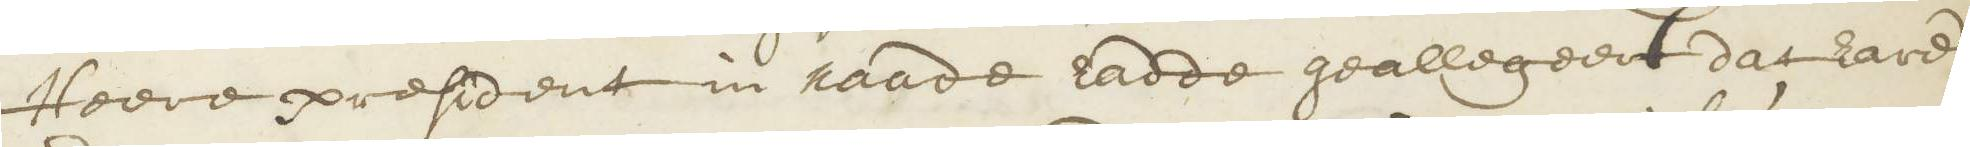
Heere president in raade hadde geallegeert dat hare
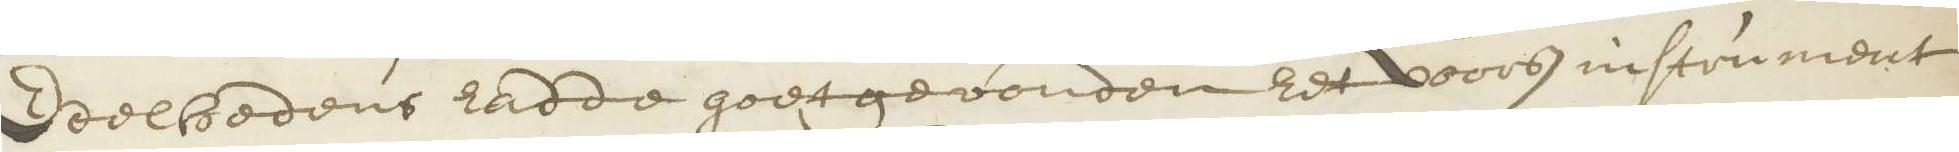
Edelhedens hadde goet gevonden het voors instrument
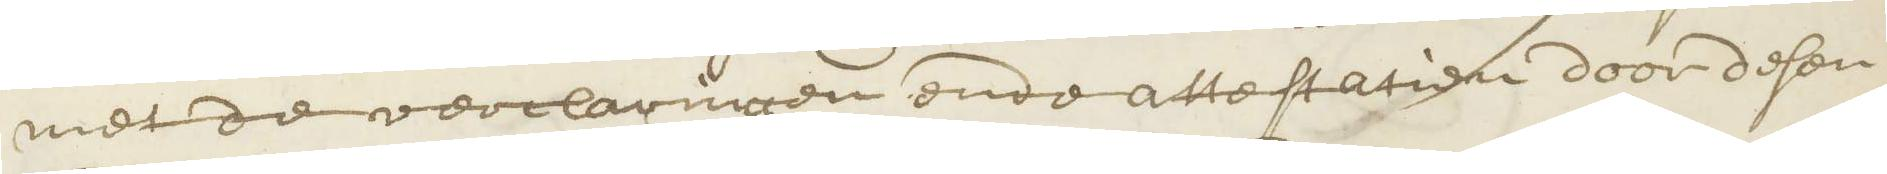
met de verclaringen ende attestatien door desen
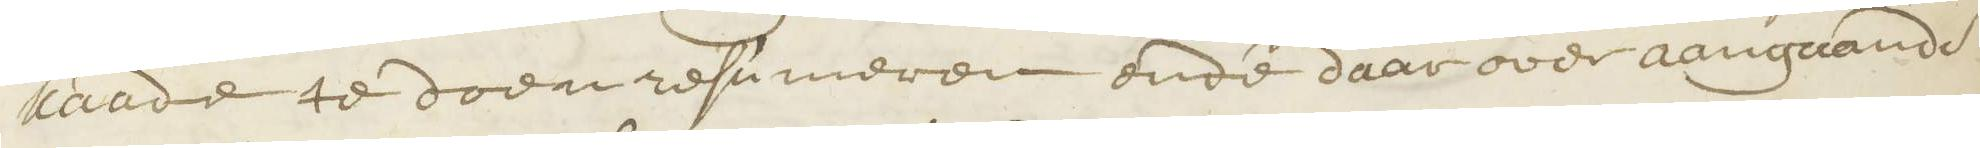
raade te doen resumeren ende daar over aangaande
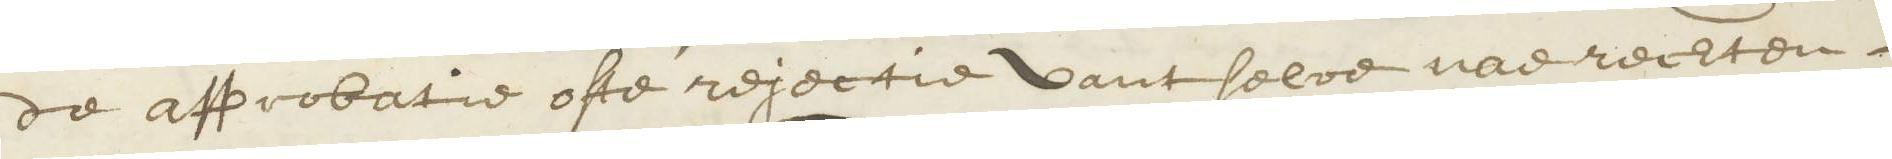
de approbatie ofte rejectie vant selve nae rechten-
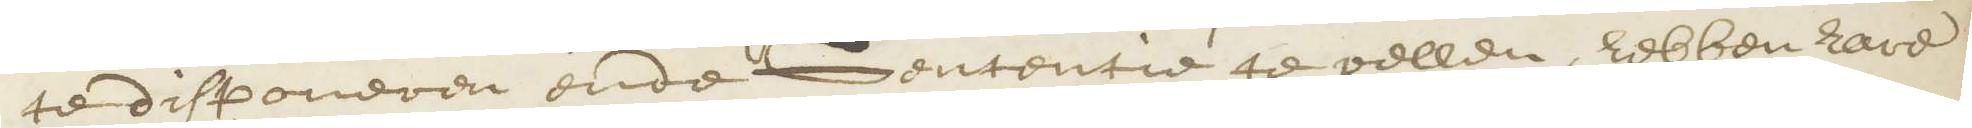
te disponeren ende Cententie te vellen, hebben hare
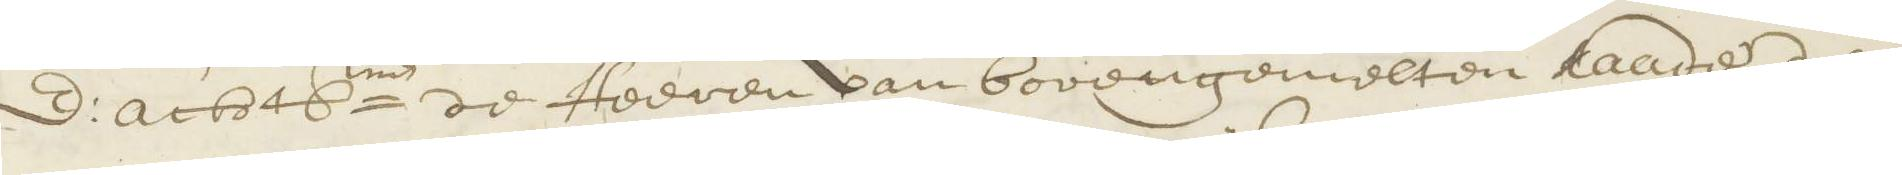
E: achtb=re de Heeren van bovengemelten raade de
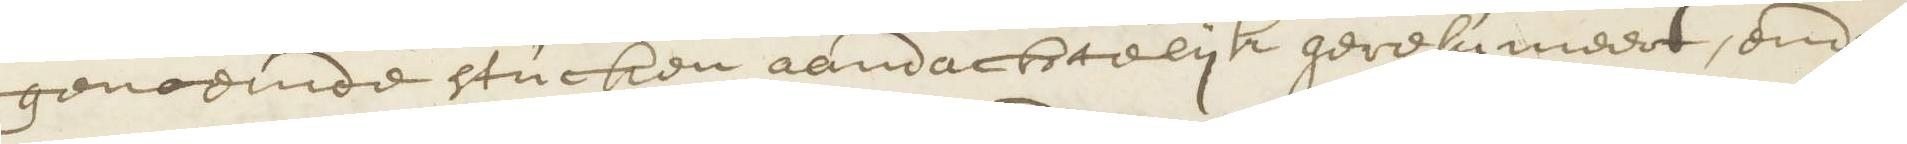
genoemde stucken aandachtelijk geresumeert, ende
